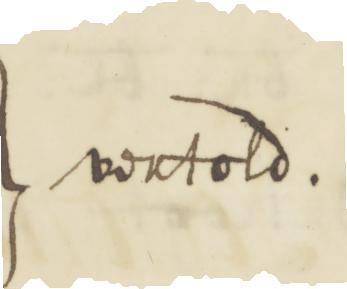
vertold.
